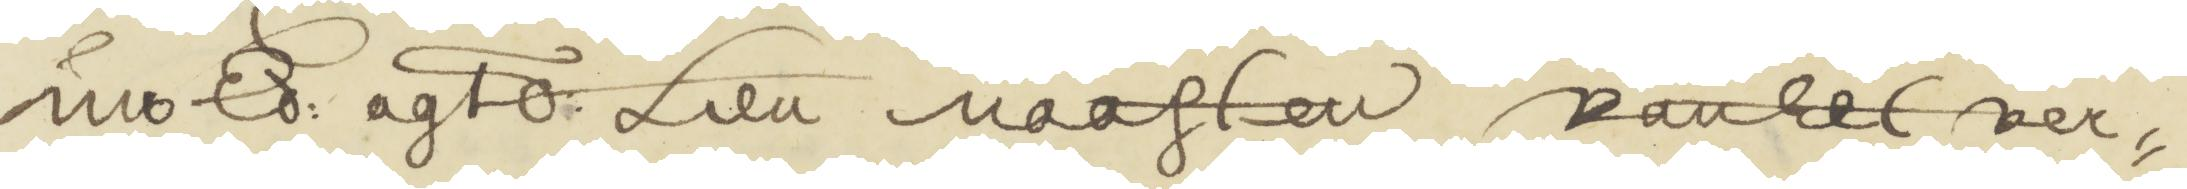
uw Ed: agtb: ter naasten van het ver„
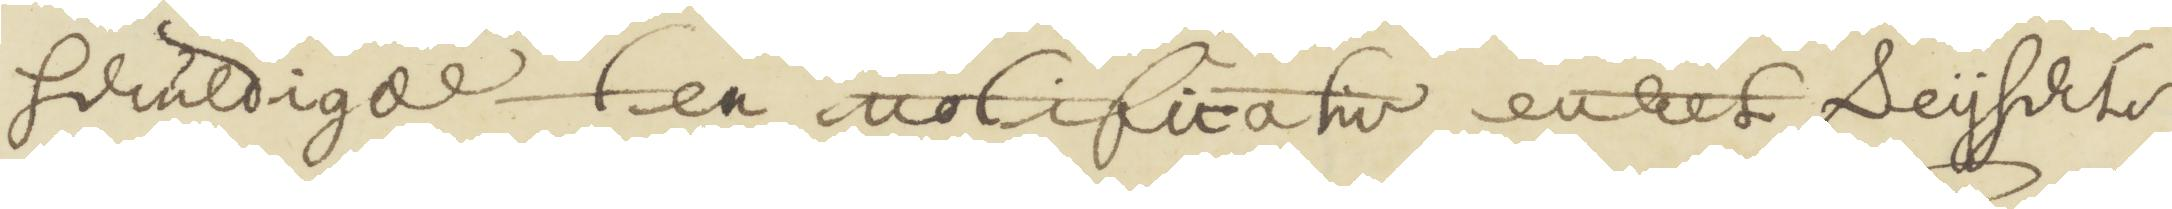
schuldigde ter notificatie en het vereijschte
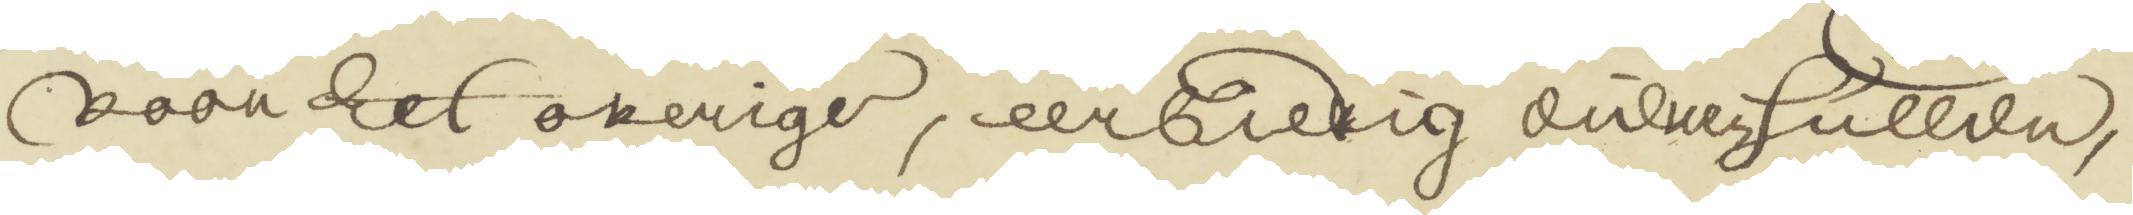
voor het overige, eerbiedig dienen sullen,
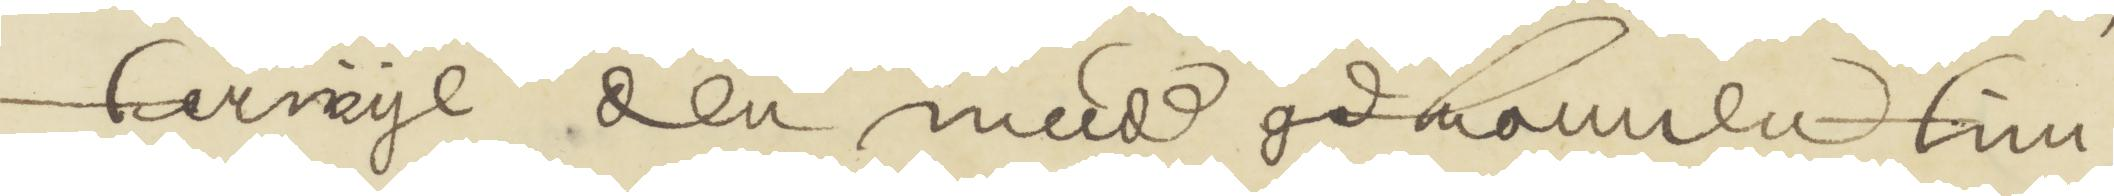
terwijl den meede gekomen tim
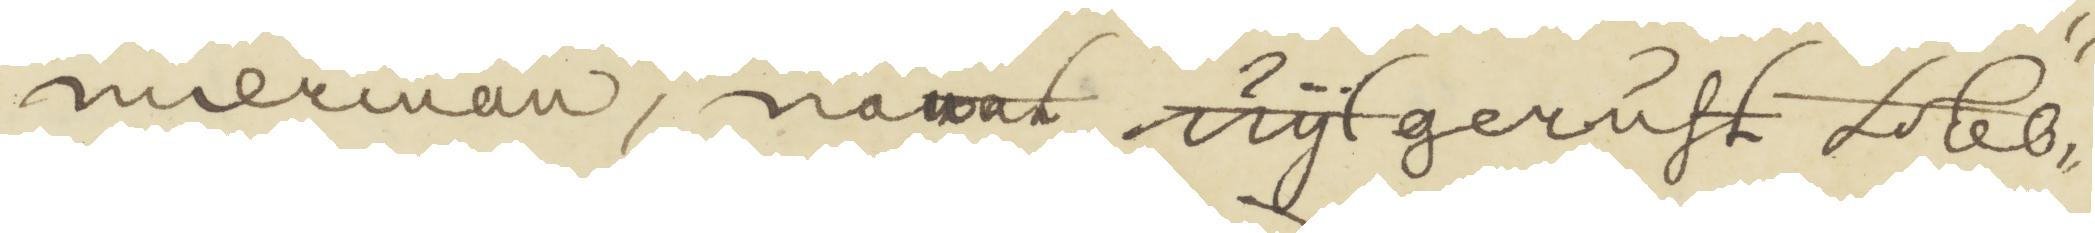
merman, na wat uijt gerust te heb„
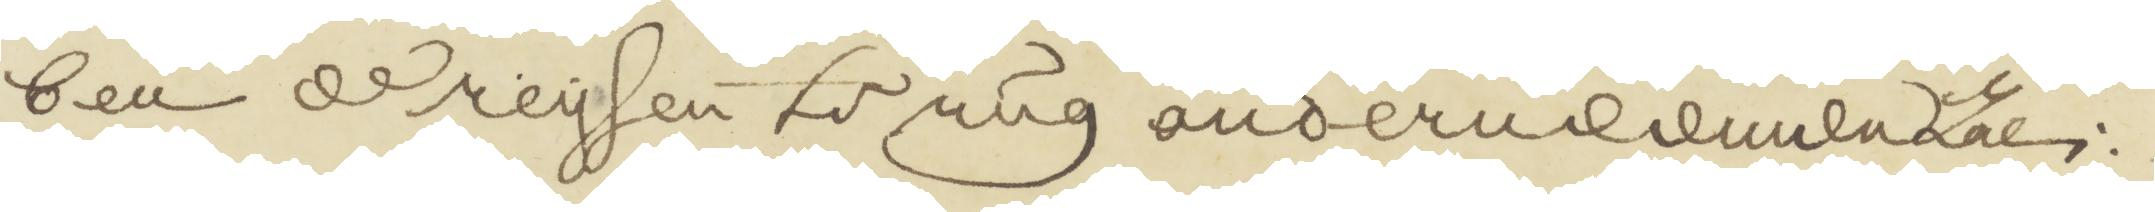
ben de reijsen te rug onder neemen zal:
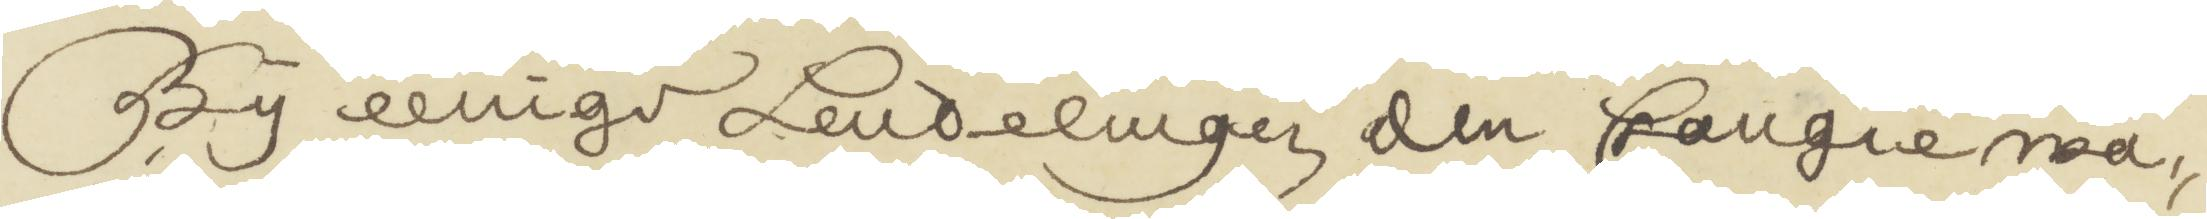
Bij eenige zendelingen den cangie wa„
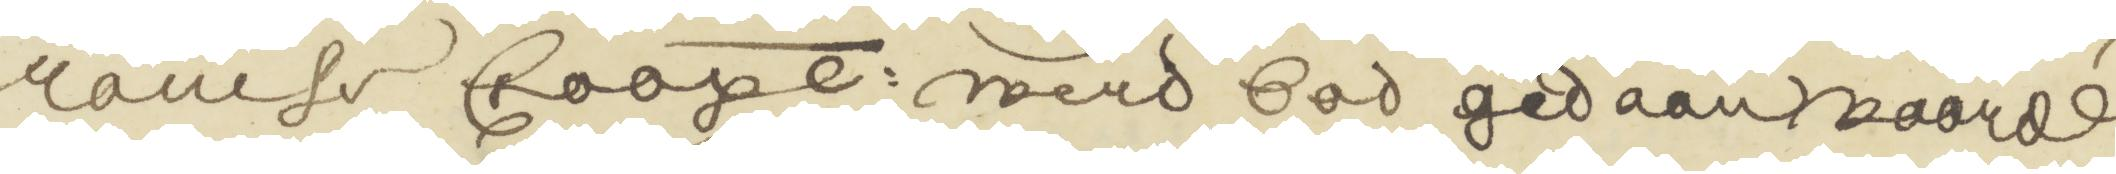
ramse Coopl: werd bod gedaan voorde
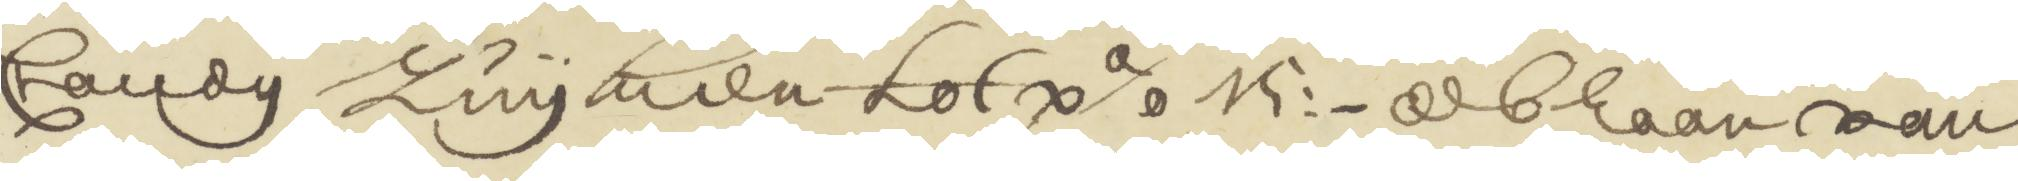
Candij zuijker tot p a/o 15:- de bhaar van
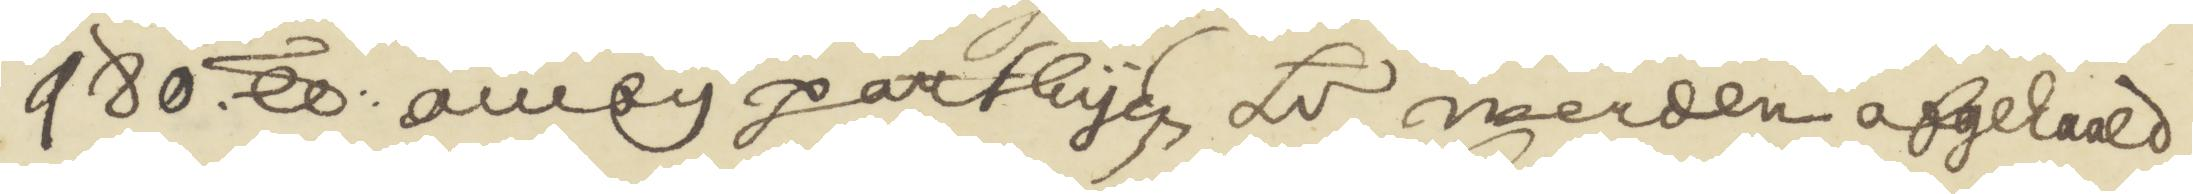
480. lb: om bij parthijen te werden afgehaald
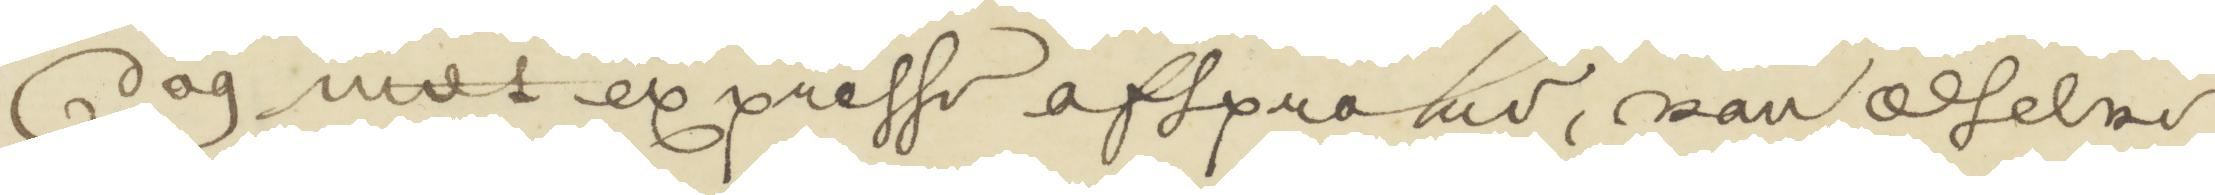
dog met expresse afsprake, van deselve
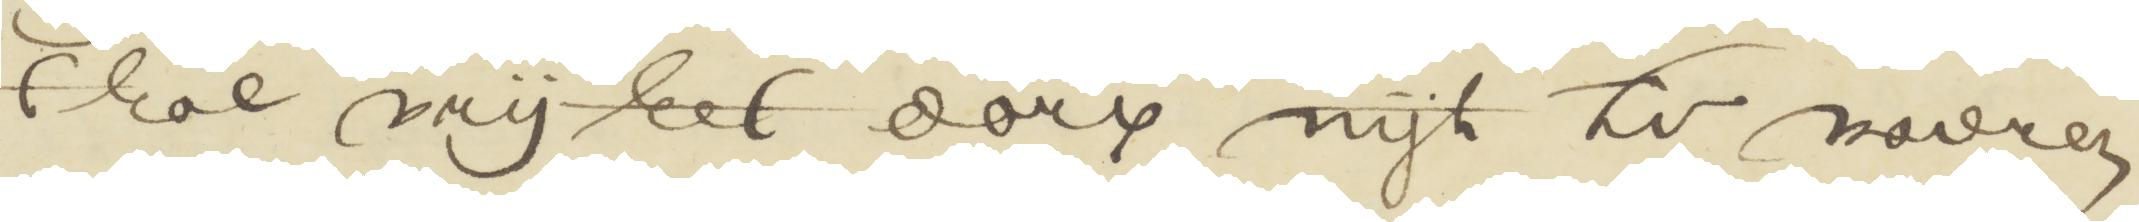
thol vrij het dorp uijt te voeren
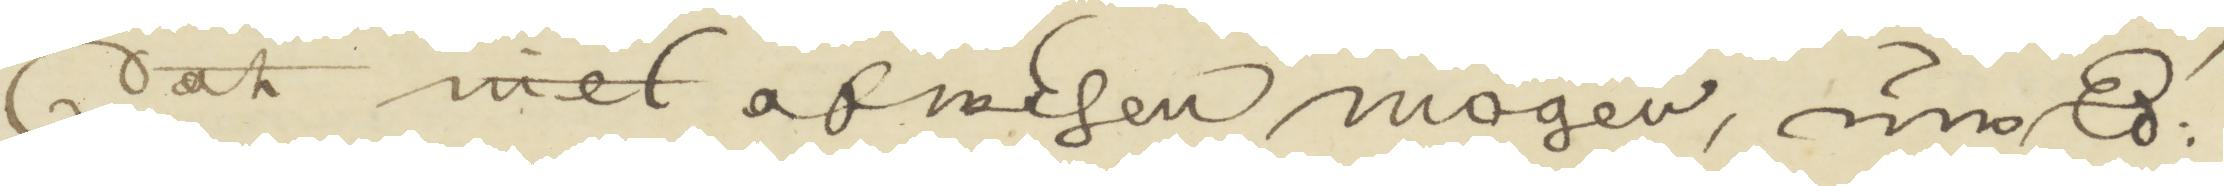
dat niet afwesen mogen, uw Ed.
